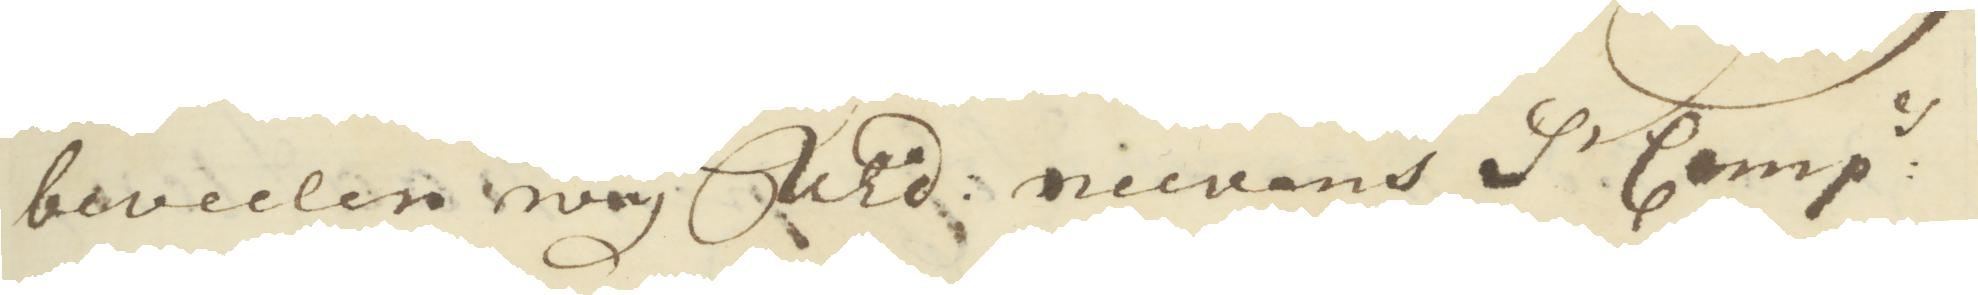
beveelen wy uEd: neevens S' Comp:s
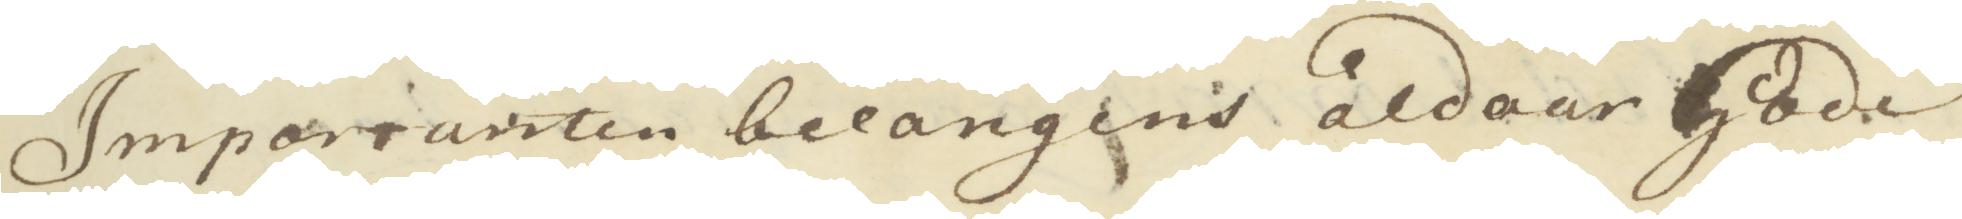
Importanten belangens aldaar Gode
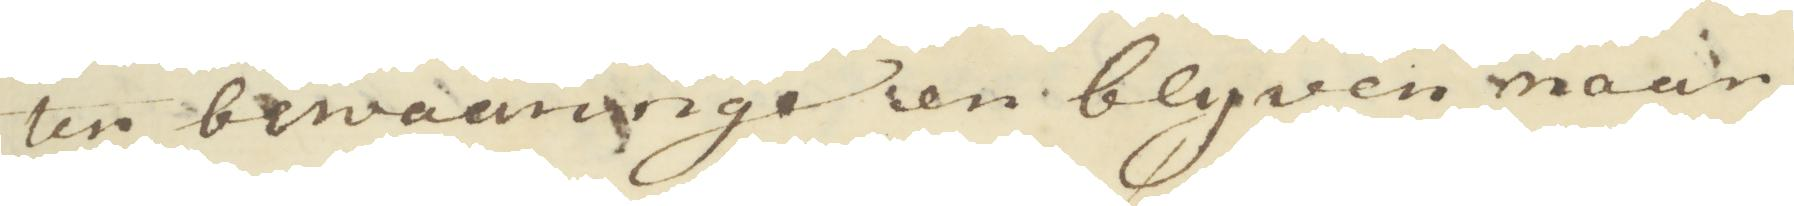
ter bewaaringe en blyven maar
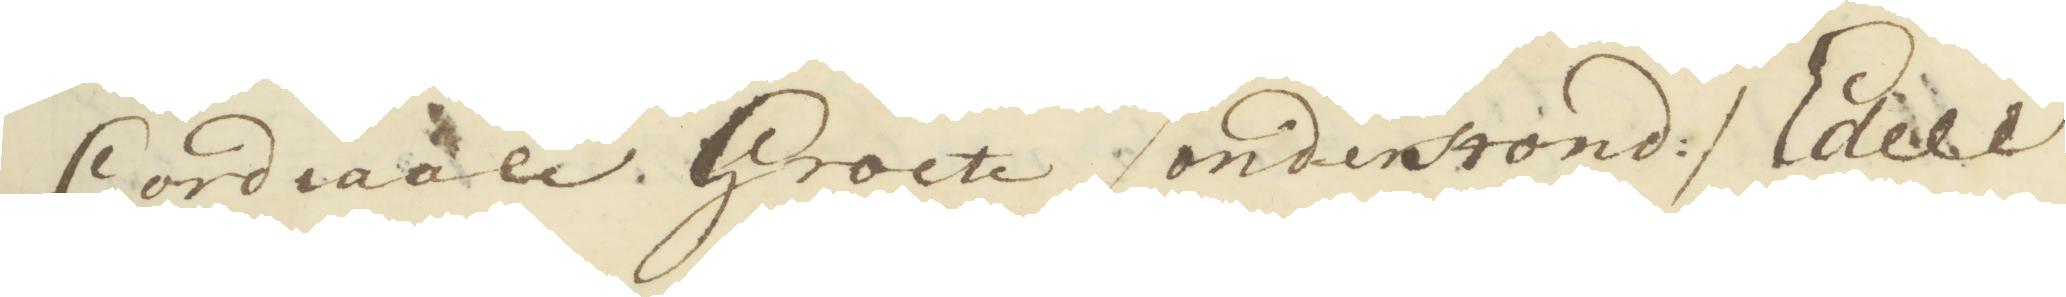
Cordiaale. Groete / onderstond:/ Edele
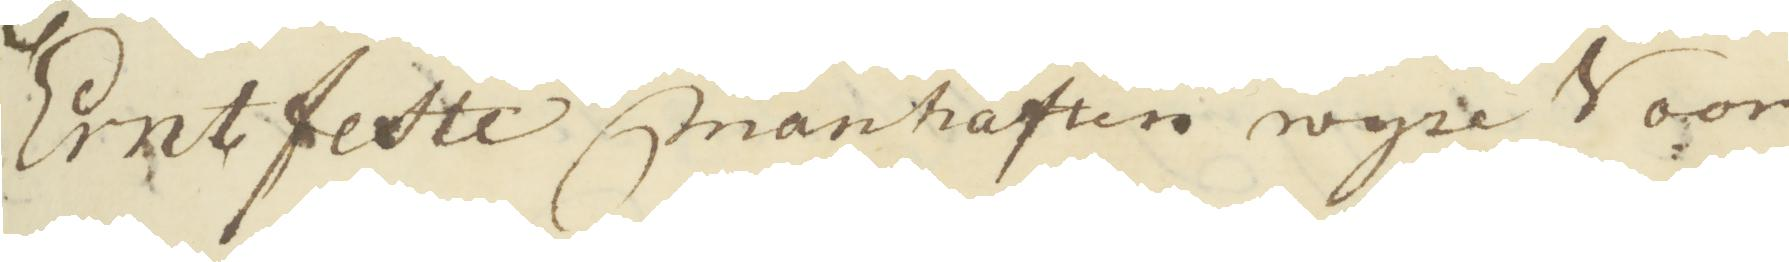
Erntfeste manhaften wyze Voor
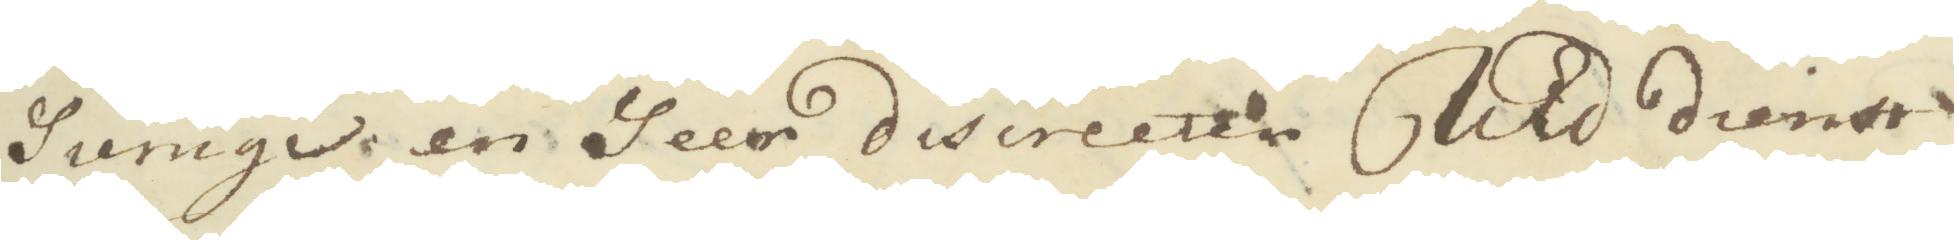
Sienige en Seer discreeten UEd dienst
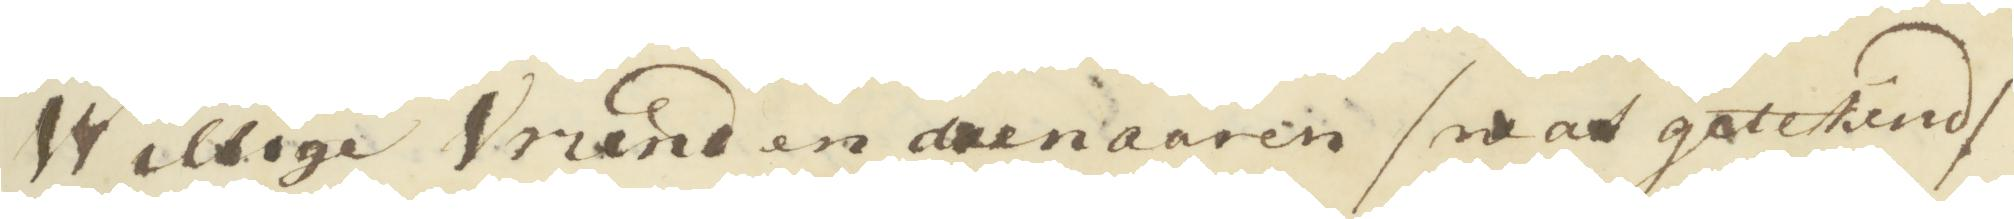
Willige Vriend en dienaaren / was getekend/
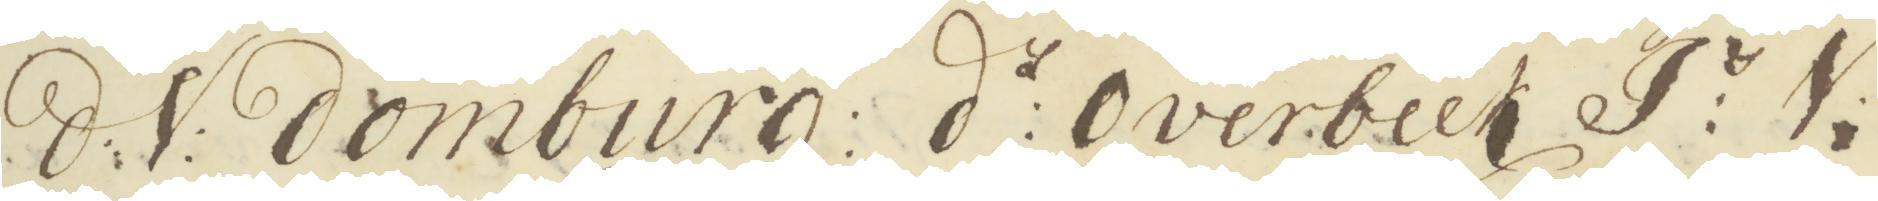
d: V: domburg: d:s overbeek I:s V:
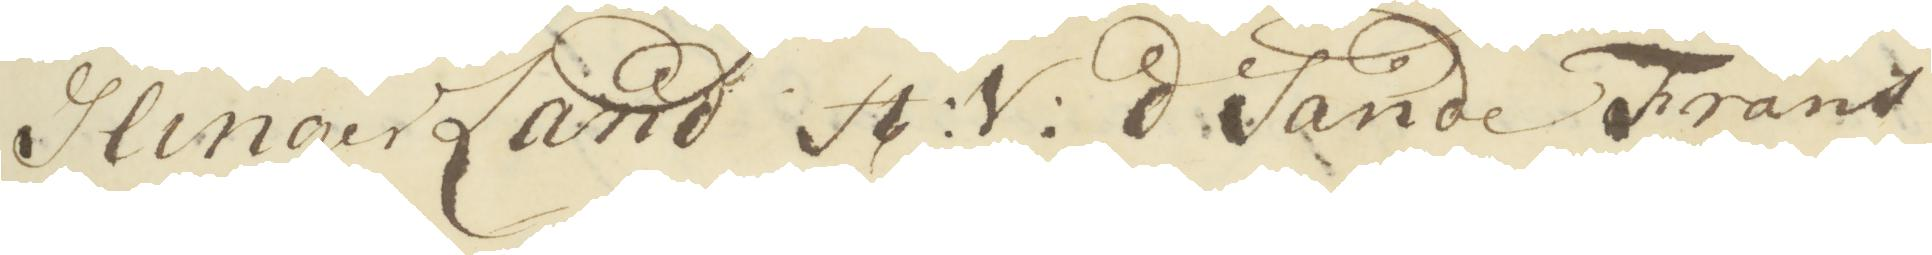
Slinger Land H: V: d: Sande Frans
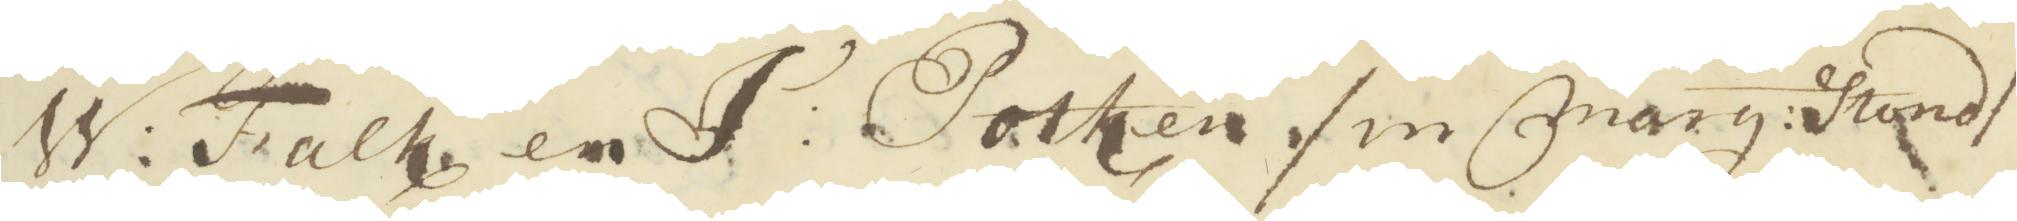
W: Falk en J:' Potken / in marg: stond/
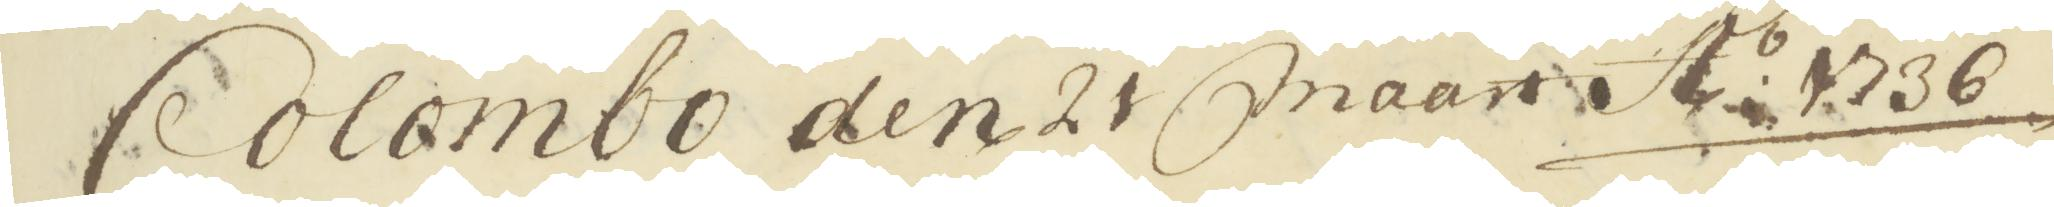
Colombo den 21 maart A„o 1736
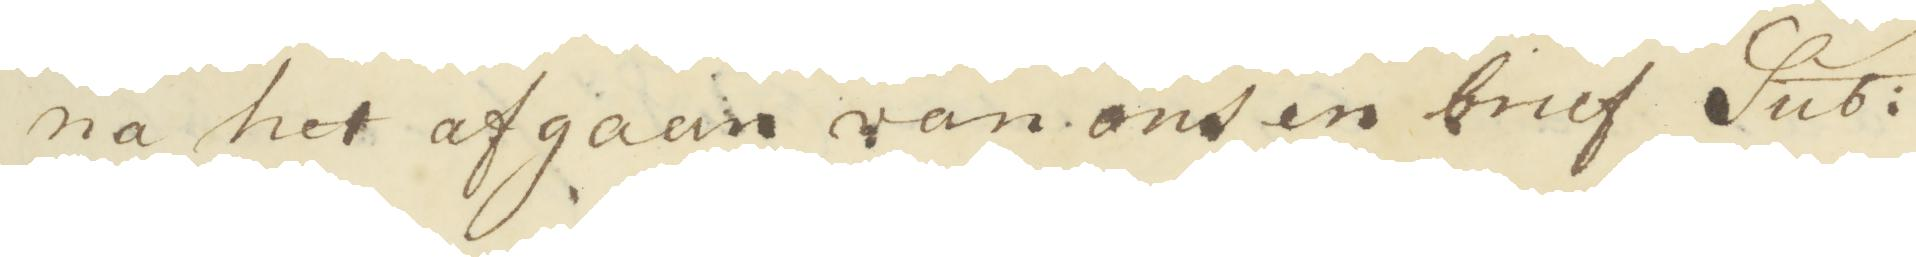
na het afgaan van onsen brief Sub:
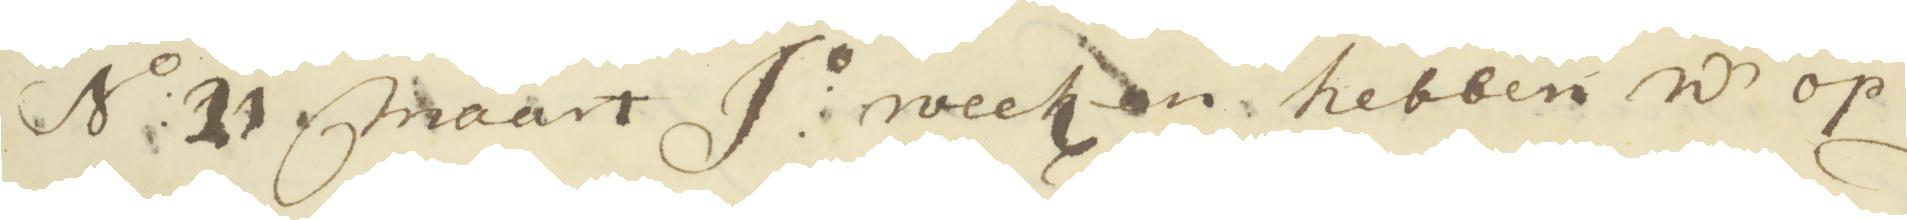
N:o 11, Maart J:o weeken hebben w' op
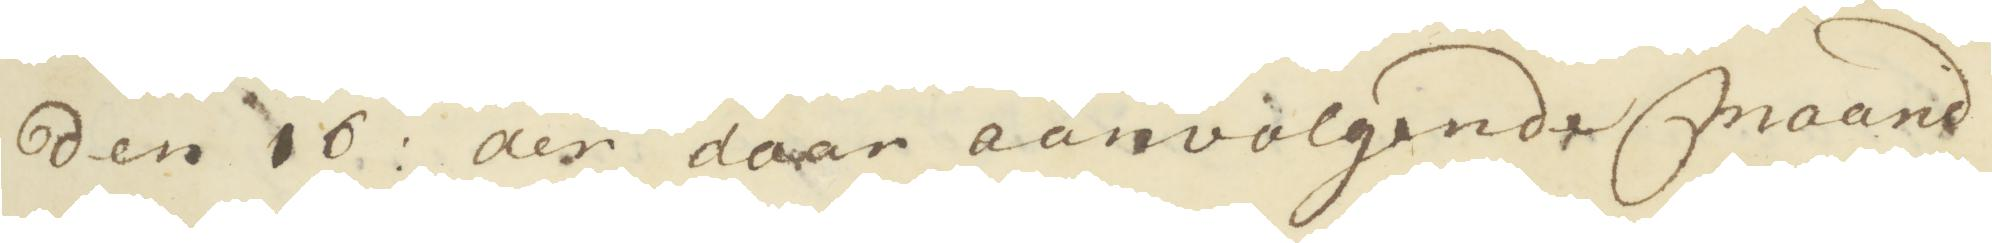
den 16:' der daar aanvolgende maand
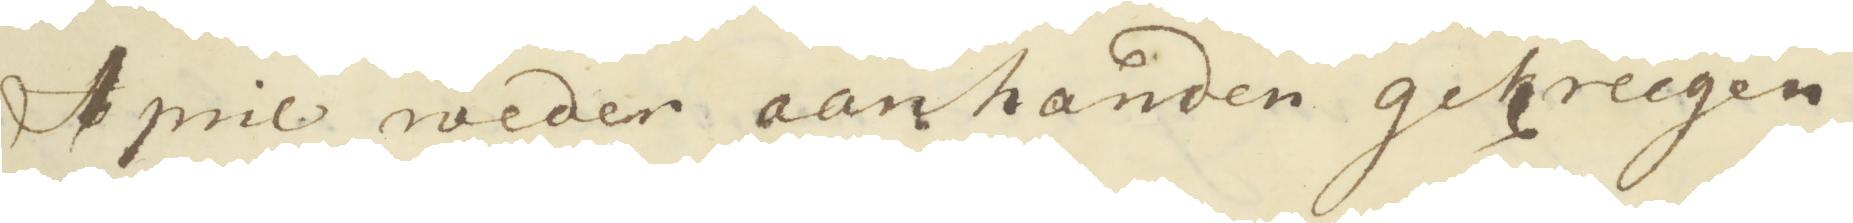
April weder aan handen gekreegen
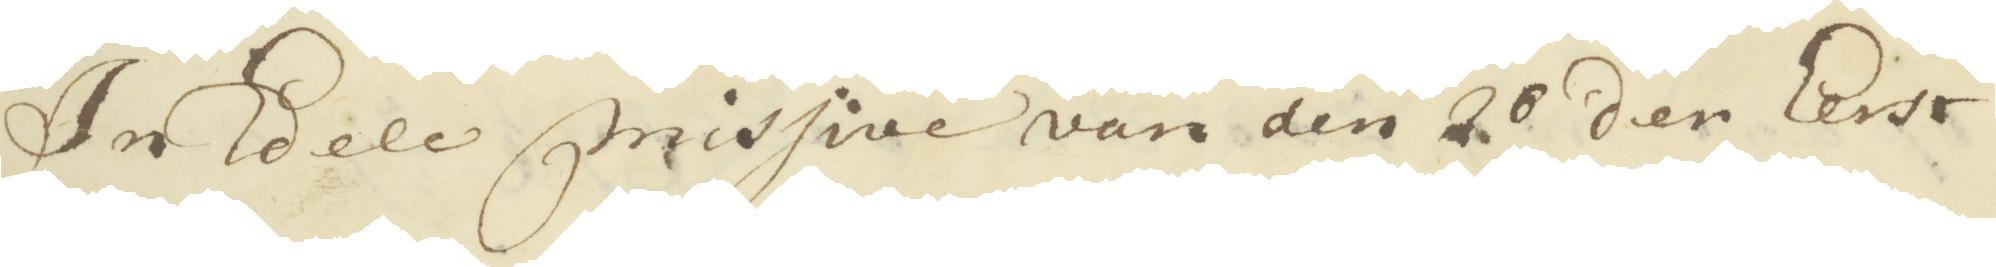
In Edele missive van den 26 der Eerst
